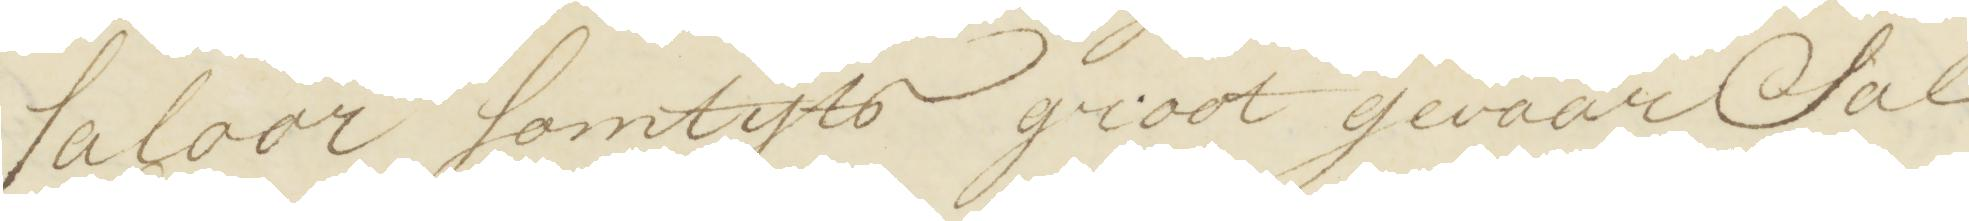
saloor somtijts groot gevaar sal
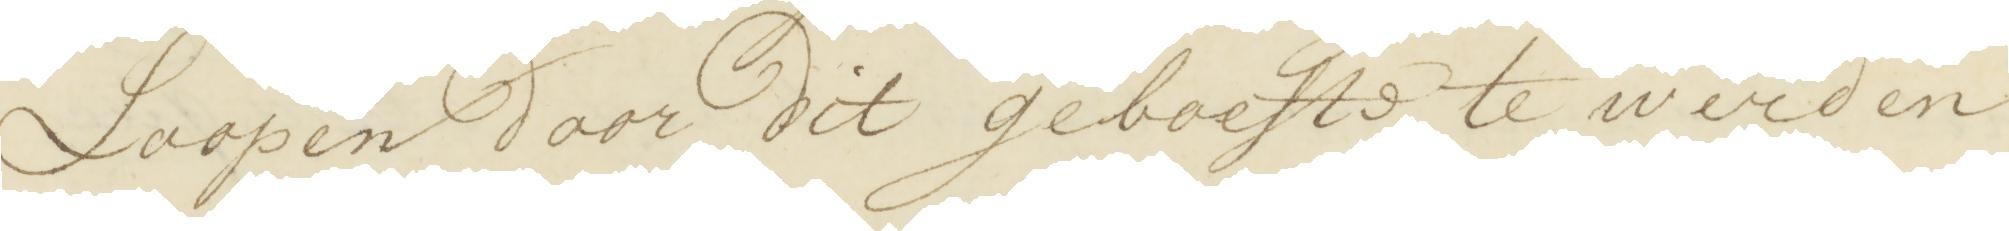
Loopen door dit geboefte te werden
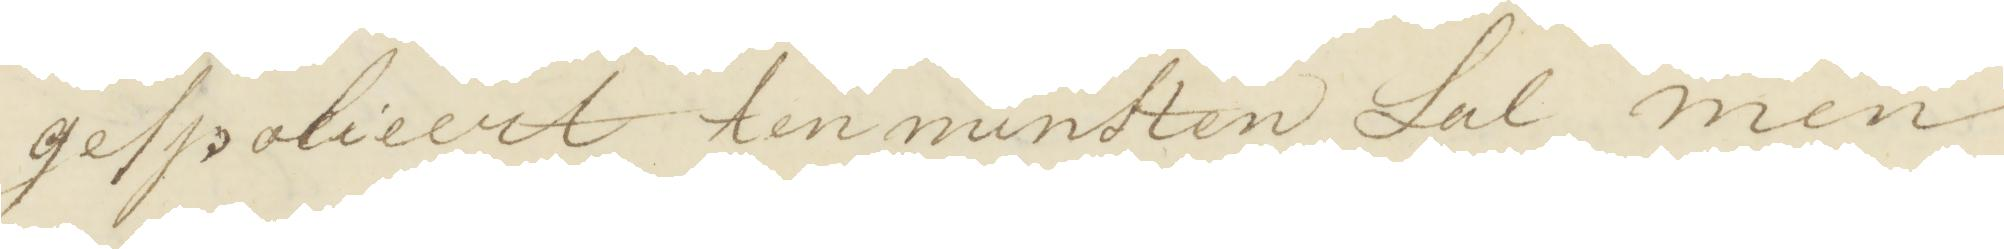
gespolieert ten minsten sal men
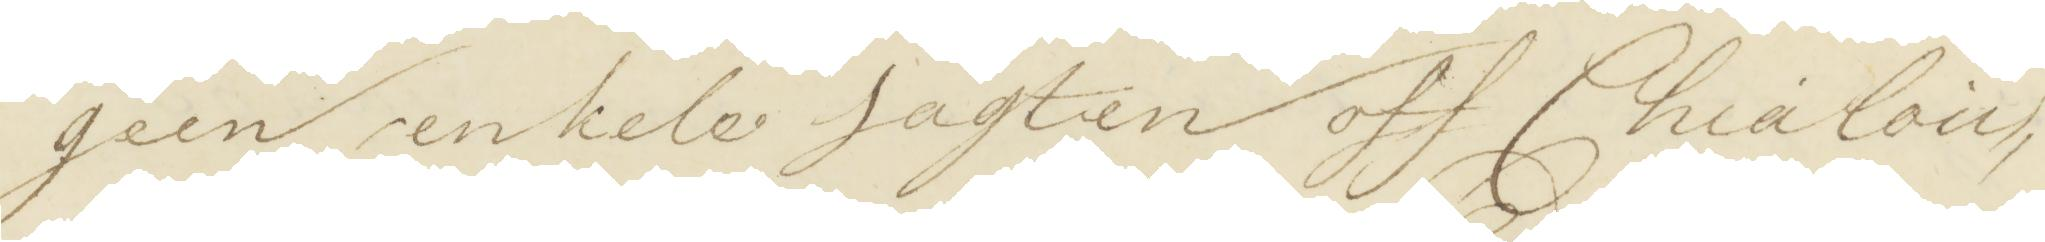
geen enkele Jagten off Chialou
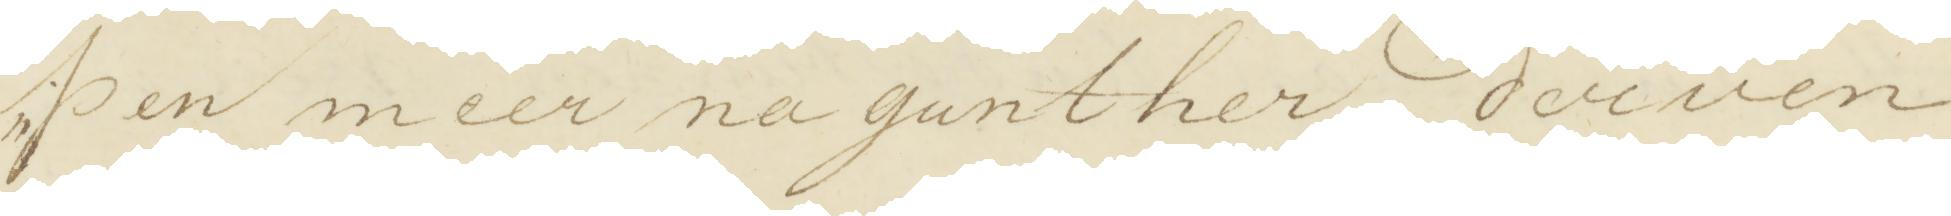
pen meer na gunther derven
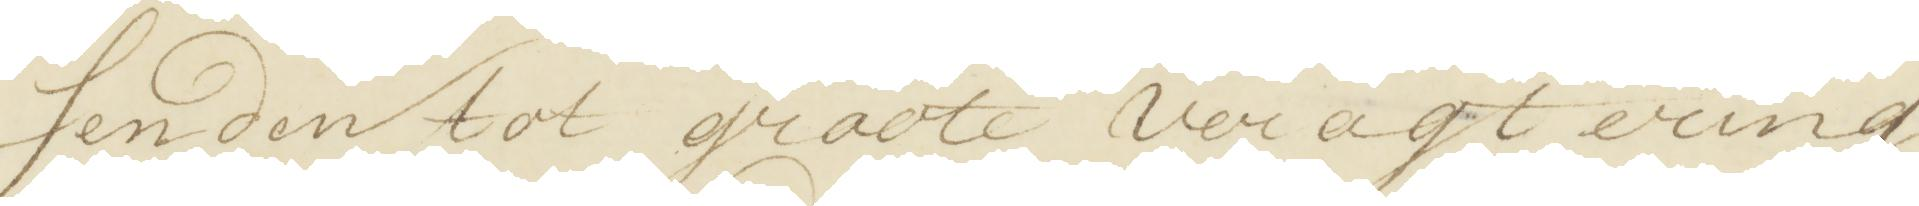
senden tot groote veragtering
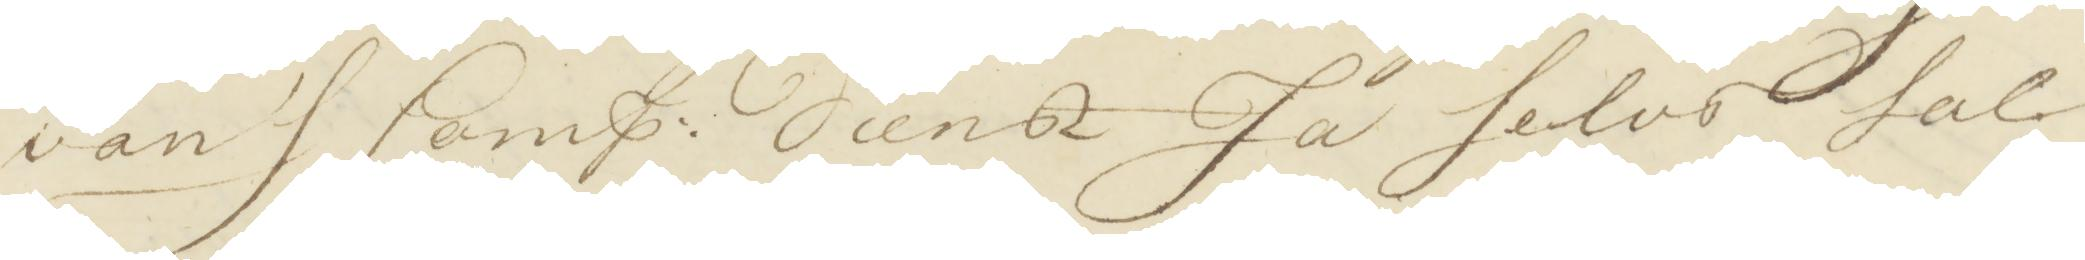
van 's Comp: dienst Ja selvs sal
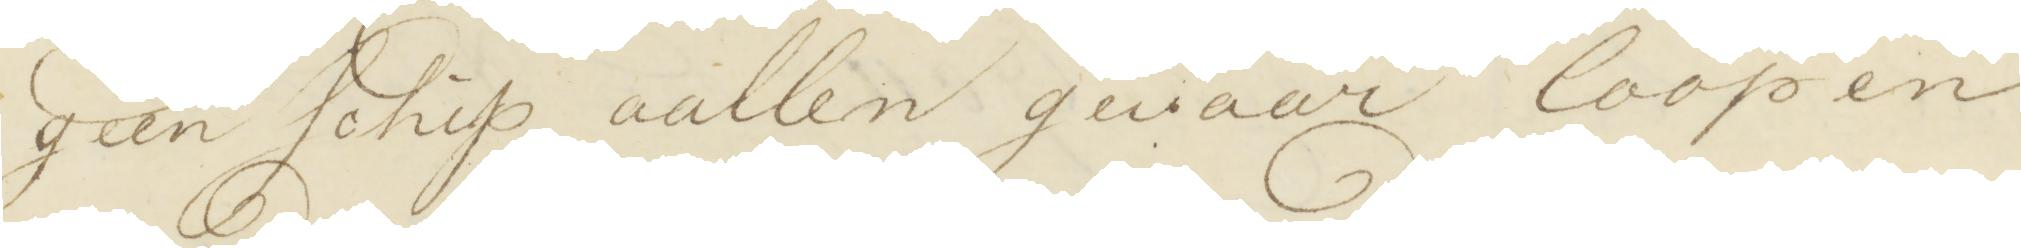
geen schip aallen gevaar loopen
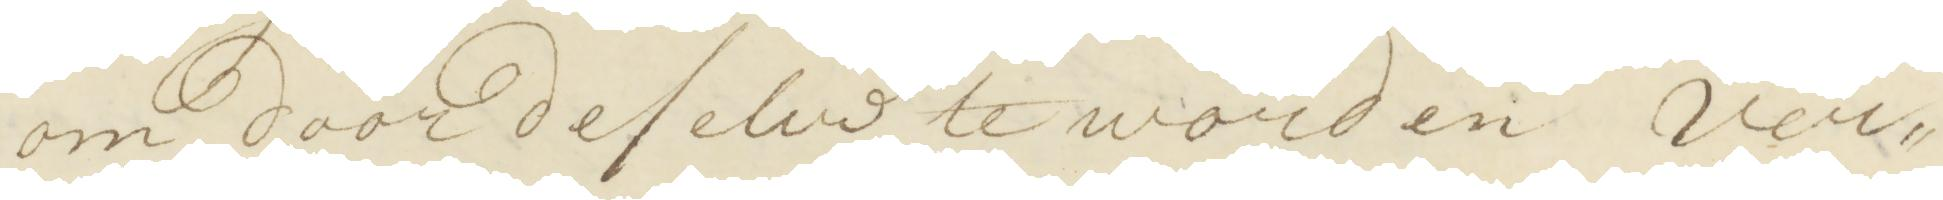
om door deselve te worden ver„
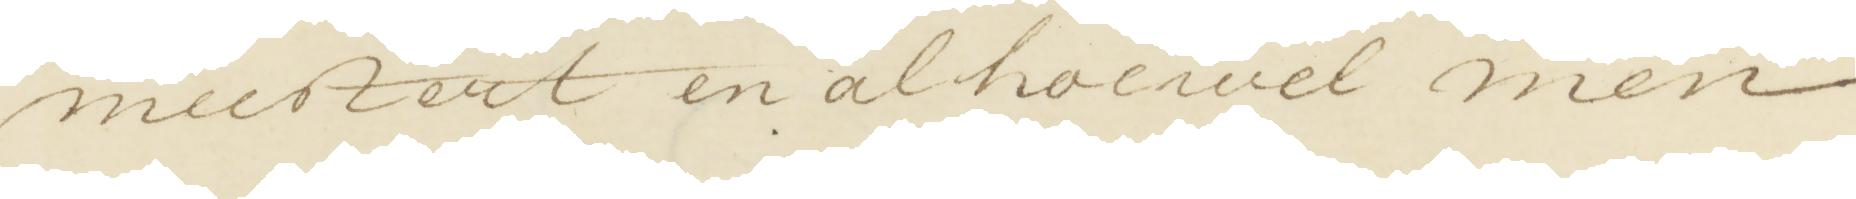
meestert en alhoewel men
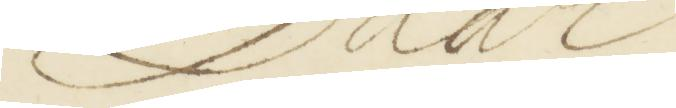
Daar
